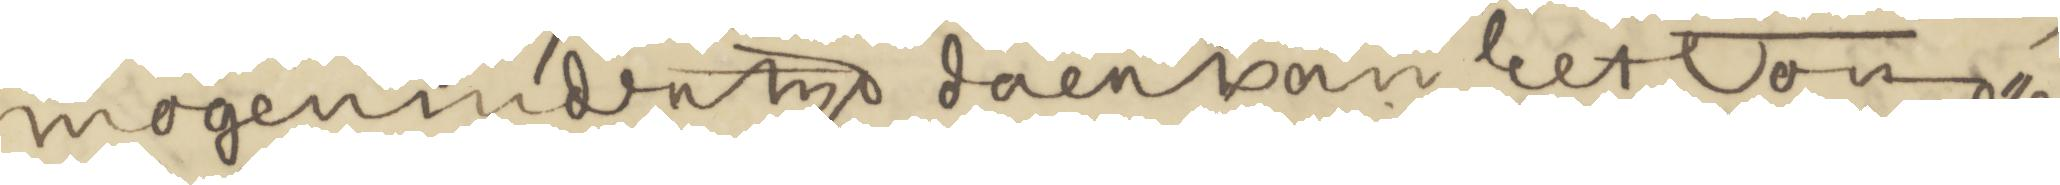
mogen inder tyd daer van het Con„
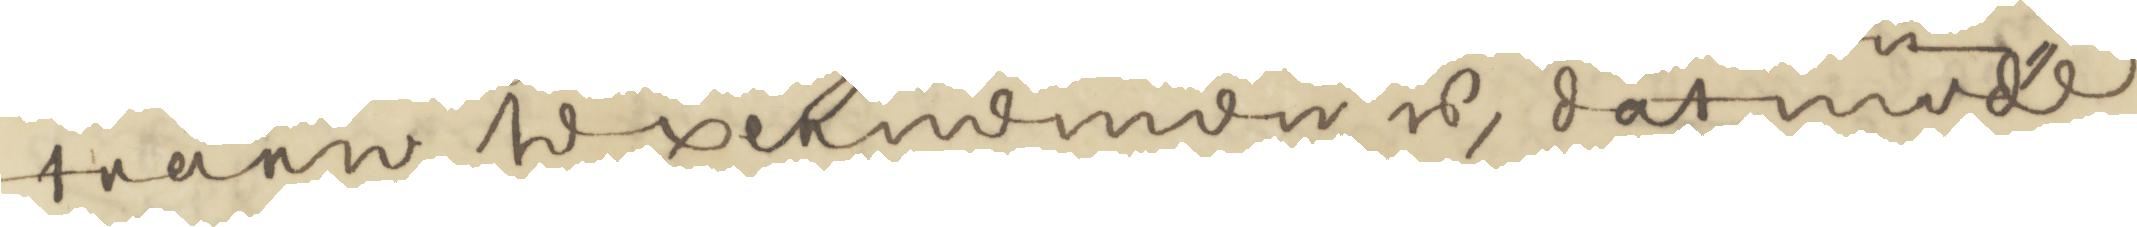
trarie te vernemen is, dat mede
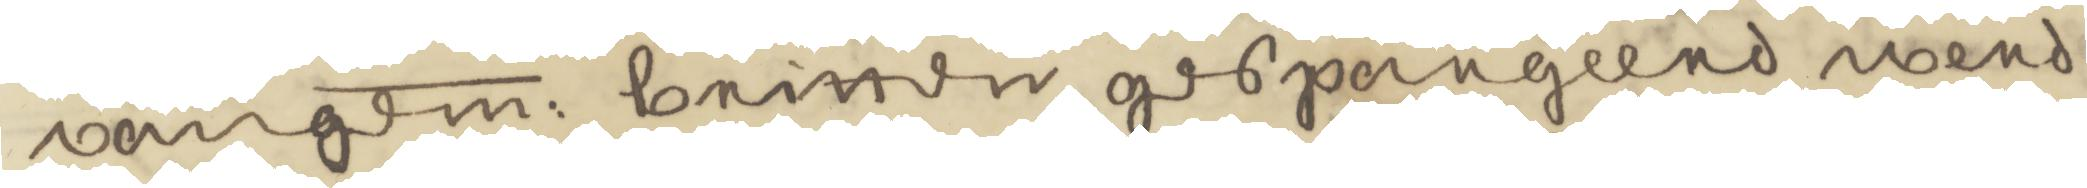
van gem: britten gespargeerd werd
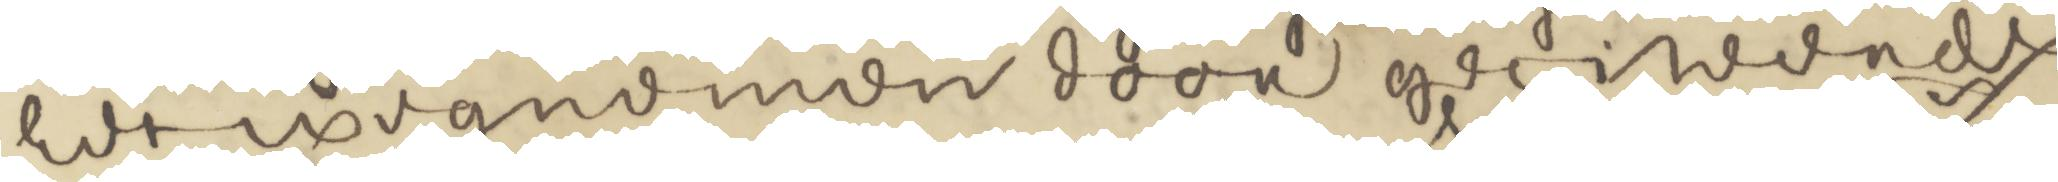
het wegnemen door geciteerde
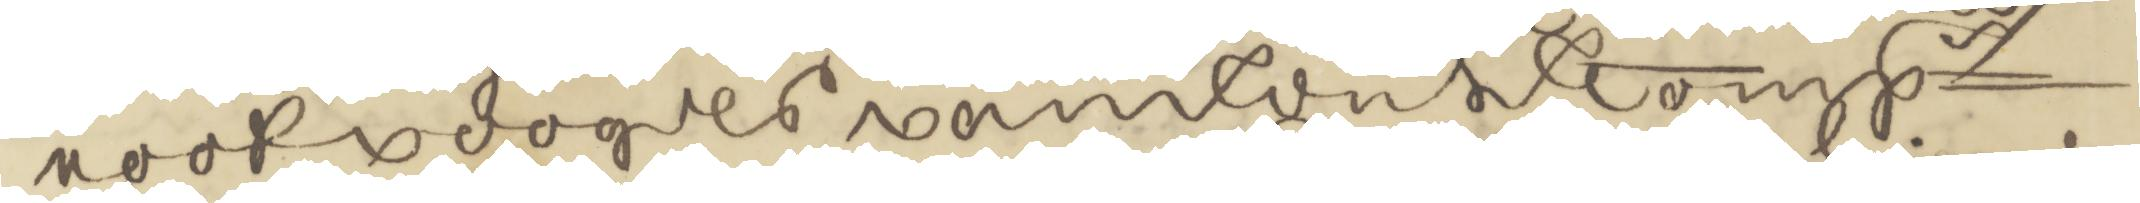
roofvoogels van Een sEComp=s
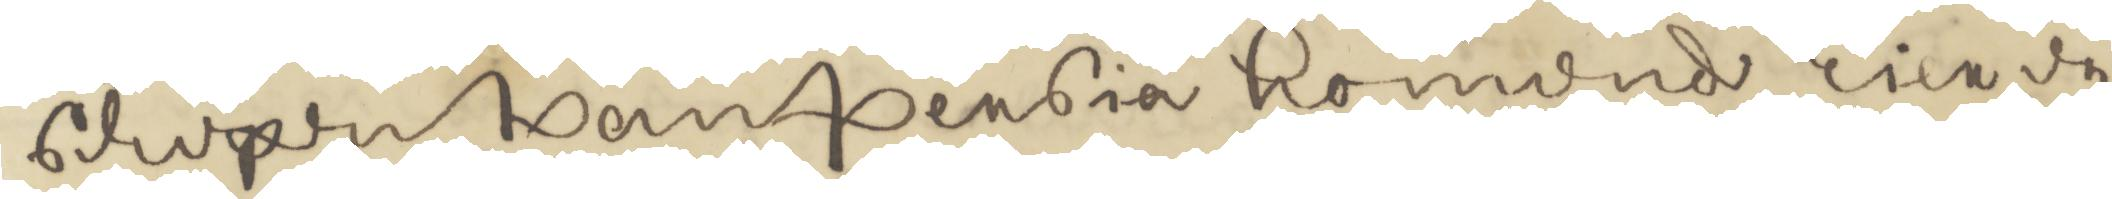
schepen van persia komende hier en
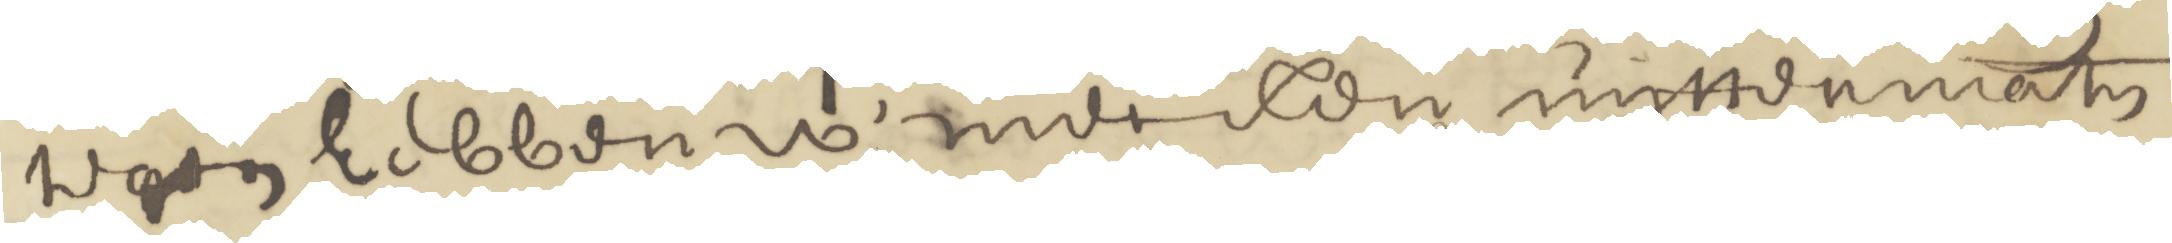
tegen hebben w' met Een uijttermaten
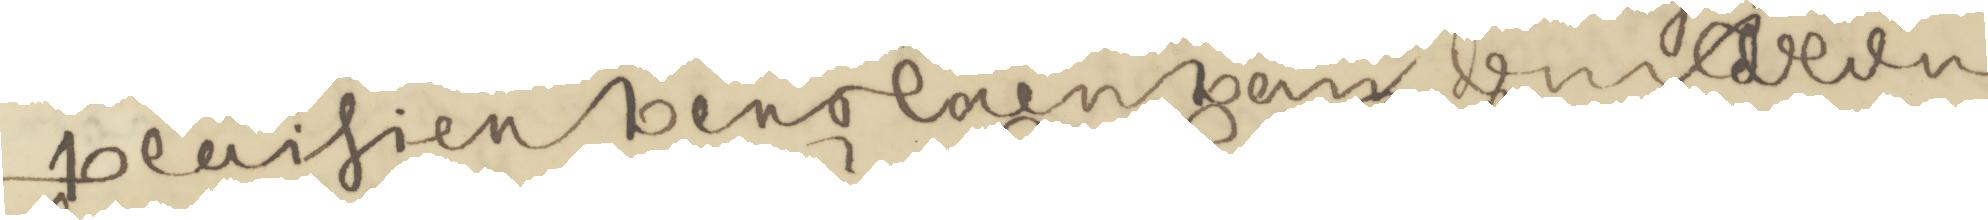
plaisier verstaen van den Edelen
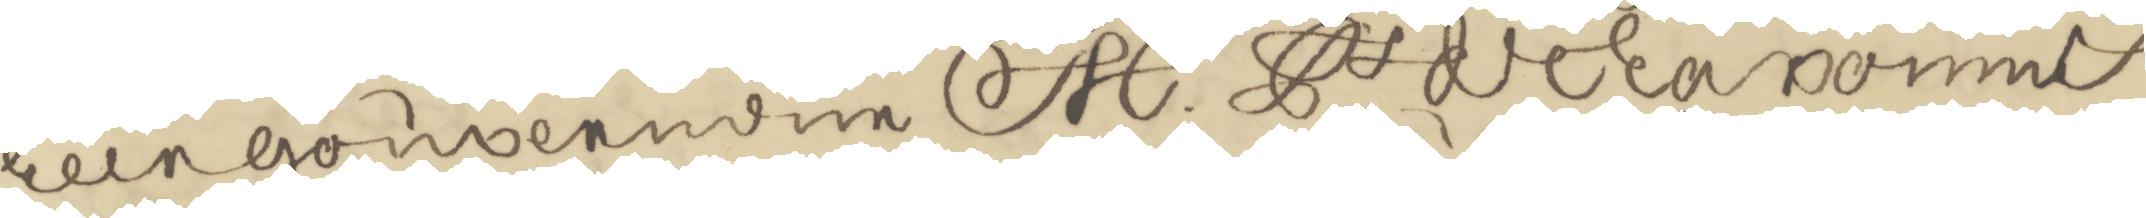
heer gouverneur M. Ps de chavonnes
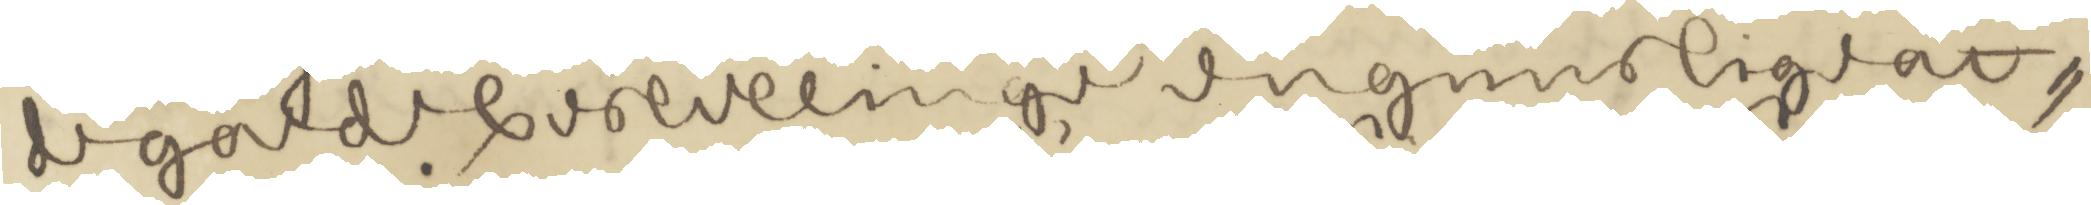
de goede bestellinge en gunstige ac„
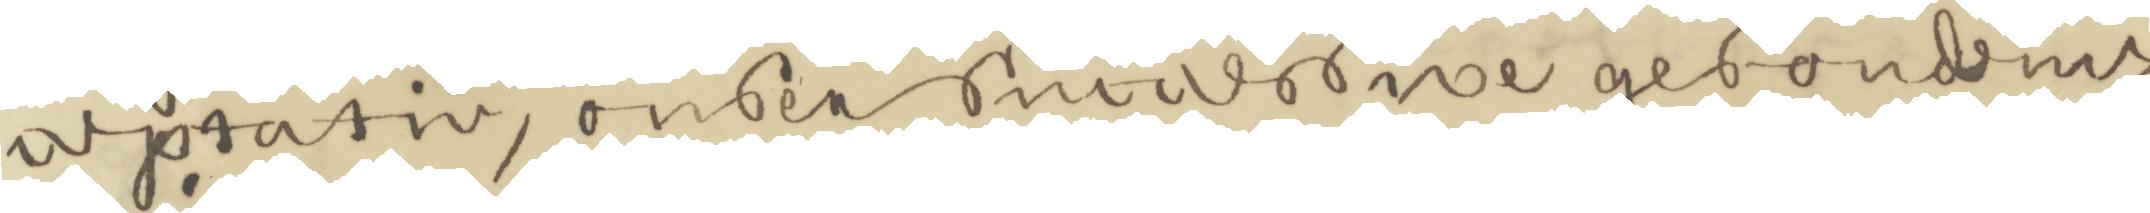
ceptatie, onser successive gesondene
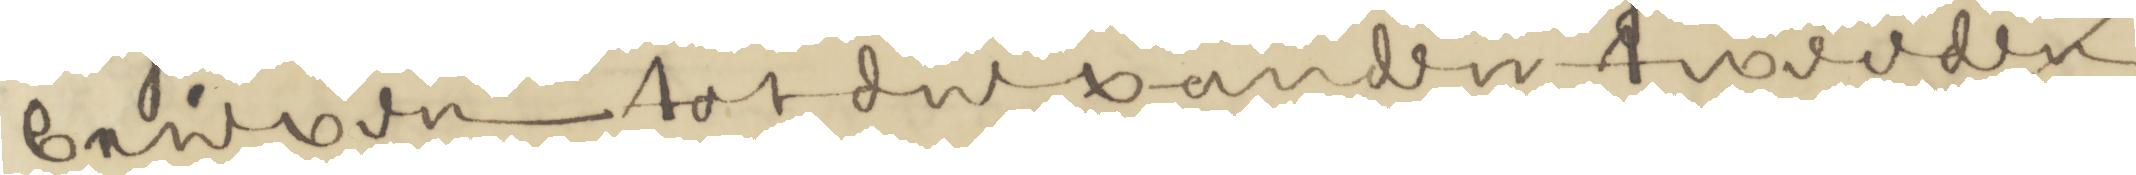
brieven tot die van den tweeden
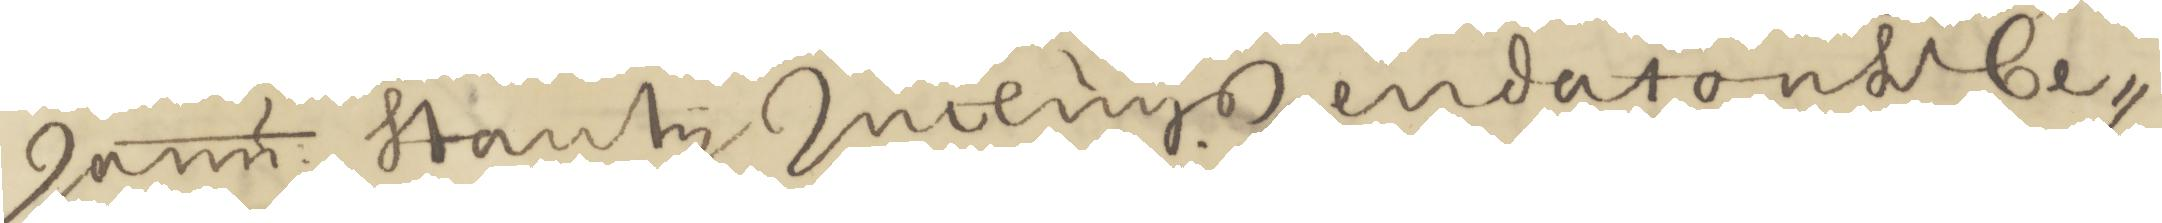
Janu: stantij Jncluijs en dat onse be„
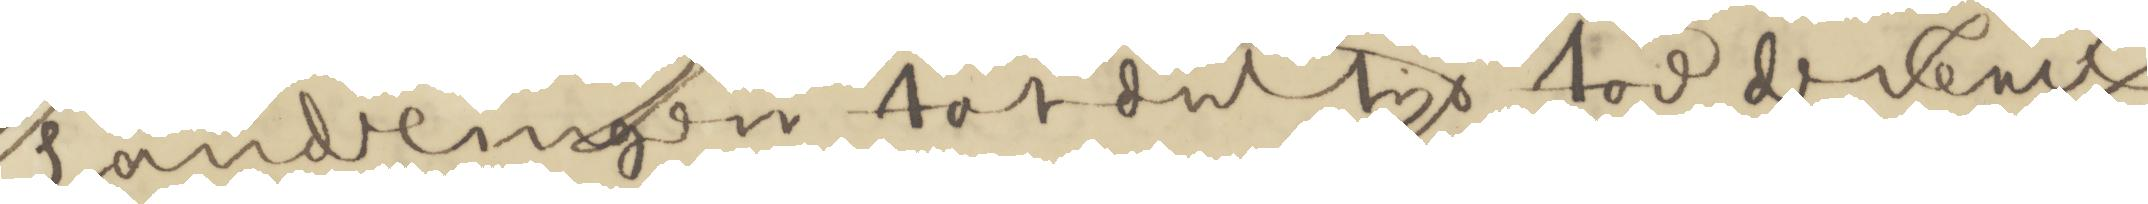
handelingen tot die tijd toe de Eere
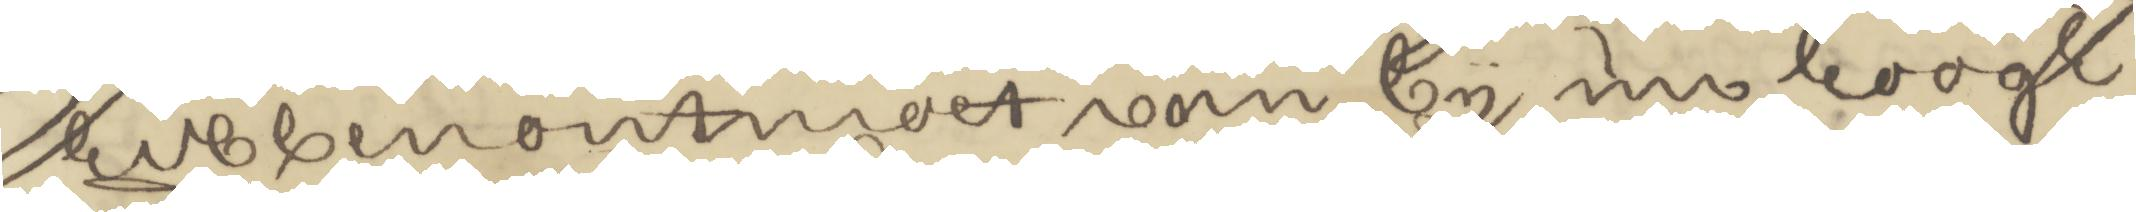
hebben ontmoet van bij uw hoogh
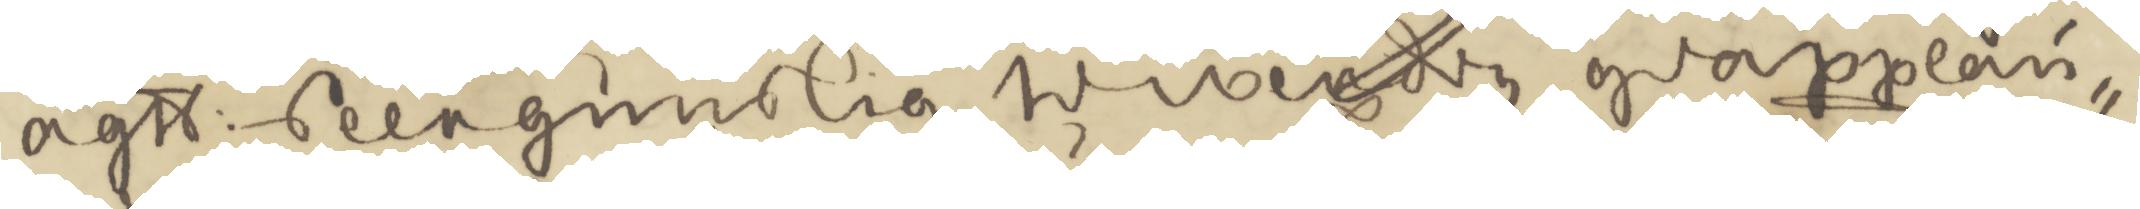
agtb: seer gunstig te werden geapplau„
